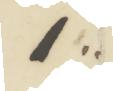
1„ -
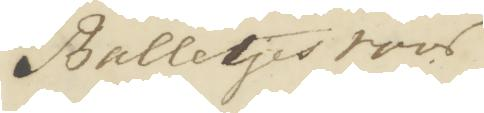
Balletjes voor
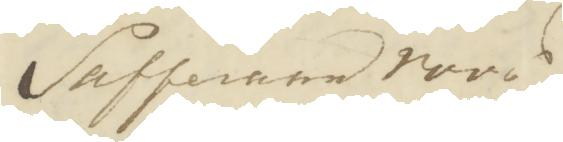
Safferaan voor
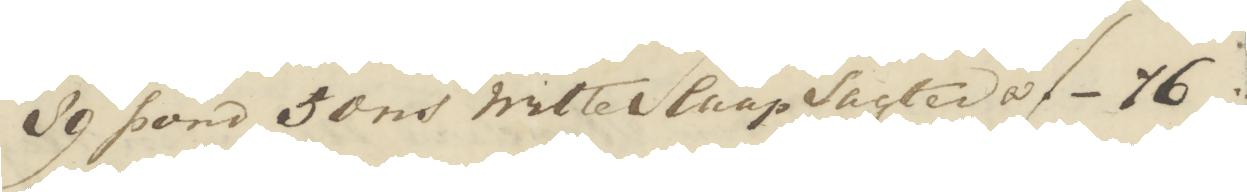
89 pond 5ons witte slaap sagter a ƒ - 76„ 68 „24.
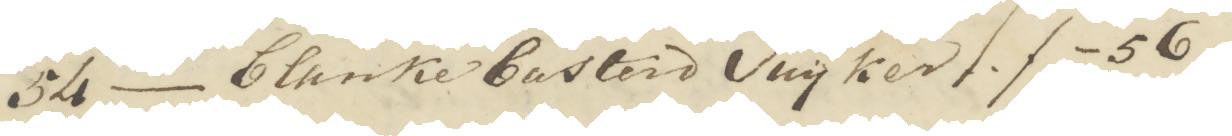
54 — blanke basterd Suijker. ƒ -56 „ 30 : 37½
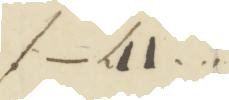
ƒ—41... 9:7½
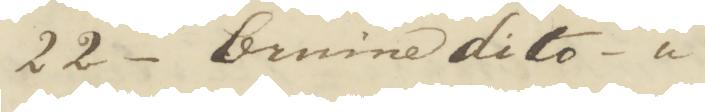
22 — bruine dito - a
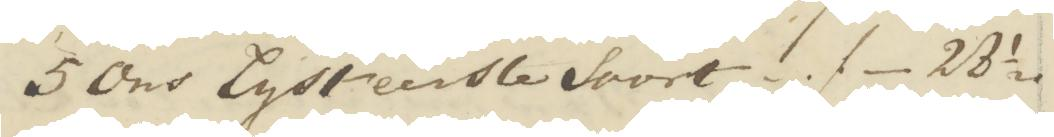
5 ons Ryst eerste soort . . ƒ — 28½ 8:19:
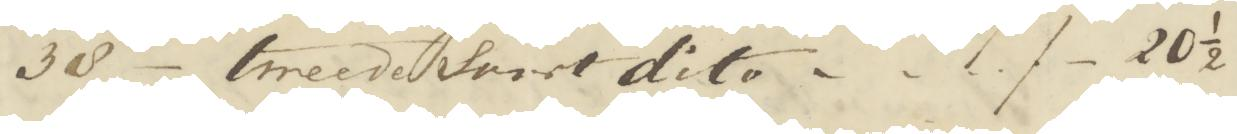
38 — tweede soort dito - - . . ƒ - 20½ 6:83:
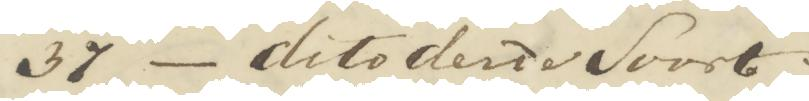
37 — dito derde Soort
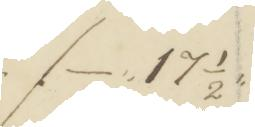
ƒ—: 17½„ 6„47½
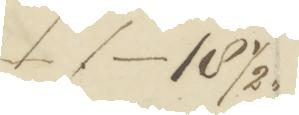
ƒ— 18½„ 3„ 58½
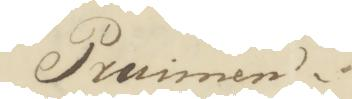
Pruimen
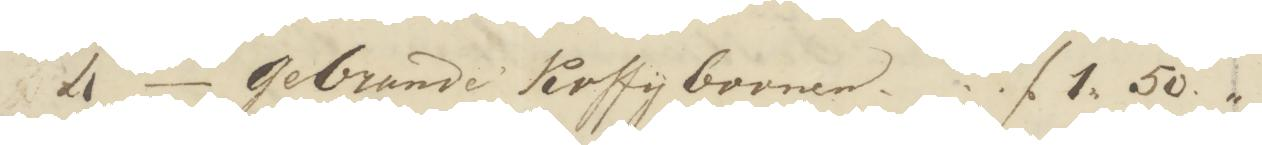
4 — gebrande Koffij boonen . . . ƒ 1: 50. „ 6„
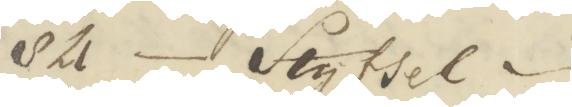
84 — Styfsel
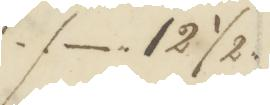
. ƒ—„ 12½„ 10„50.
